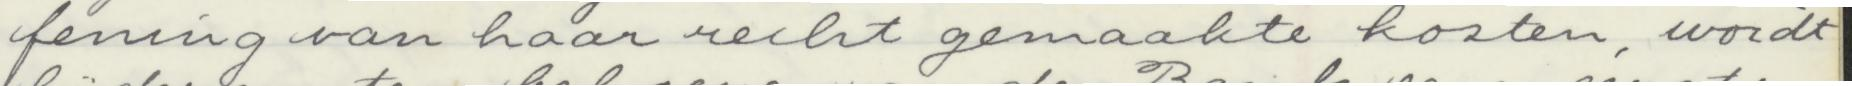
fening van haar recht gemaakte kosten, wordt
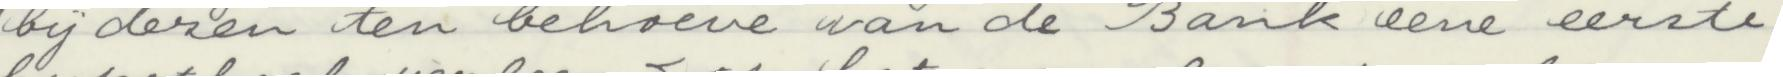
bij dezen en behoeve van de Banke eene eerste
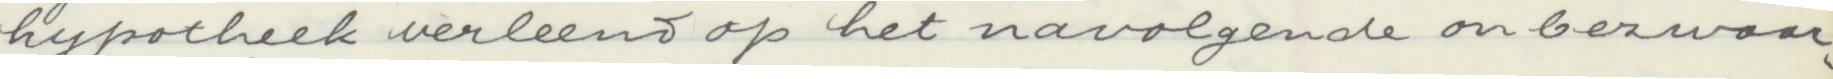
hypotheek verleend op het navolgende onbezwaar
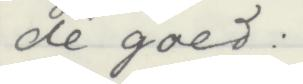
de goed:
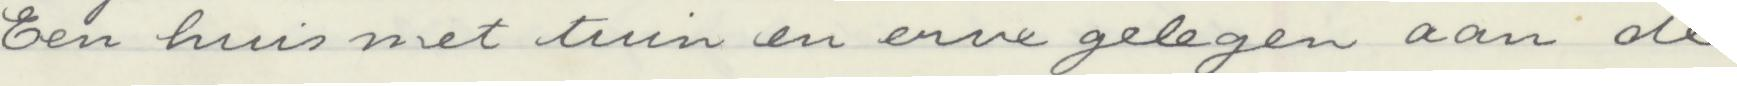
Een huis met tuin en erve gelegen aan de
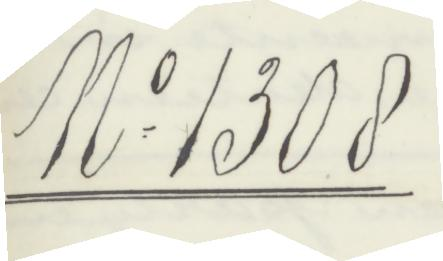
N=o 1308
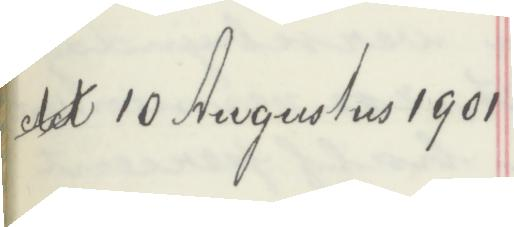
dd 10 Augustus 1901
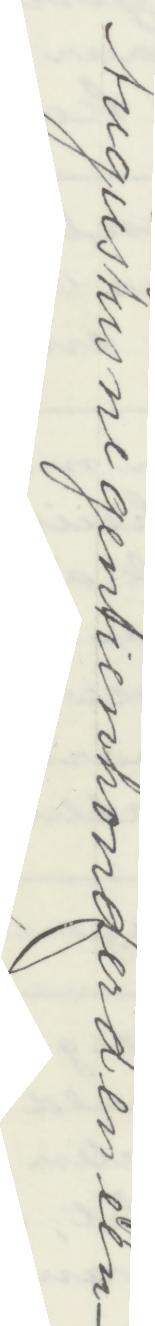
Augustus negentienhonderd en één
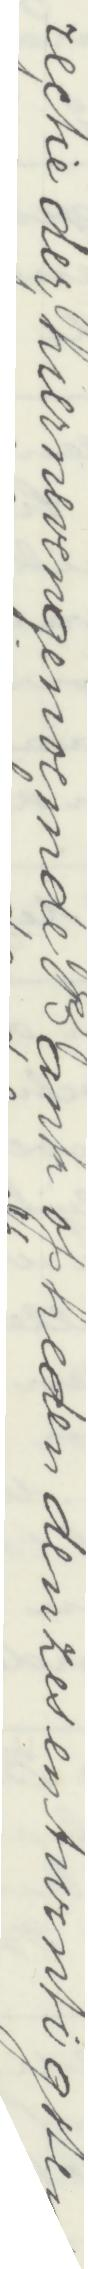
rectie der hiernevengenoemde Bank op heden den zes en twintigsten
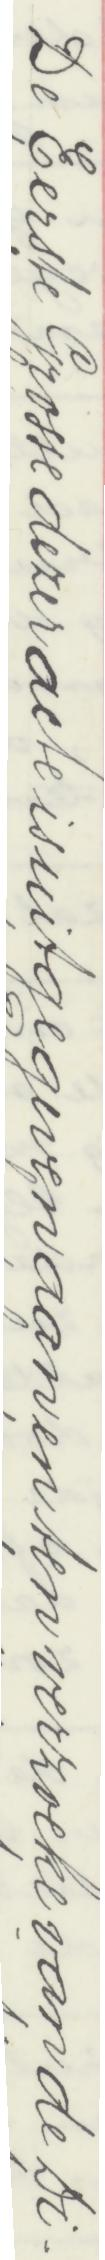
De Eerste Grosse dezer acte is uitgegeven aan en ten verzoeke van de Di-
